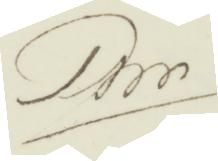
Pmjr
